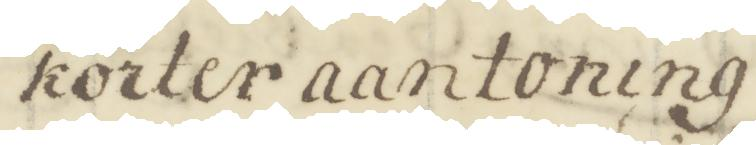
korter aantoning
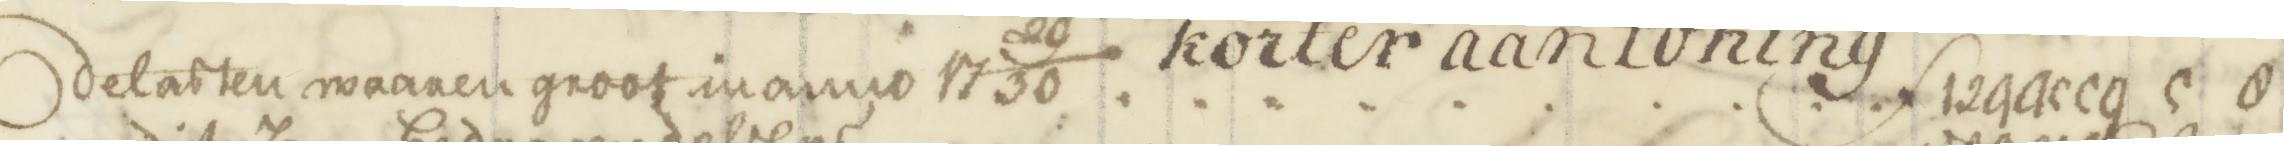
de lasten waaren groot in anno 1729/30 . . . . . . . . . . ƒ1294559 5 8
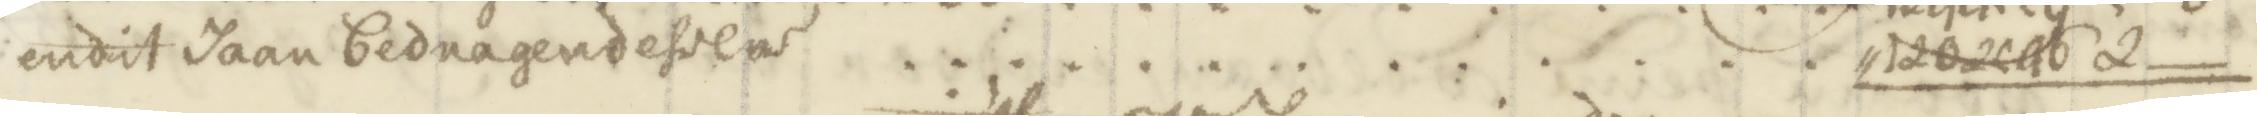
en dit Iaar bedragen deselve . . . . . . . . . . . . . „1202546 2 —
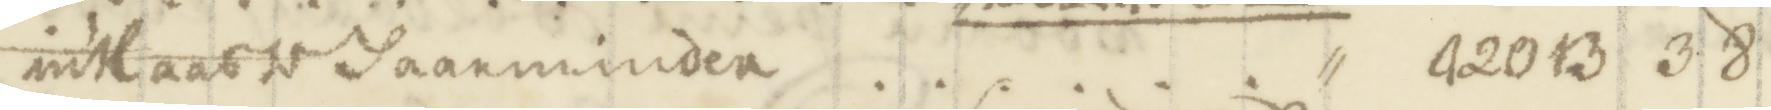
in't laaste Iaar minder . . . . . . „ 42013 3 8
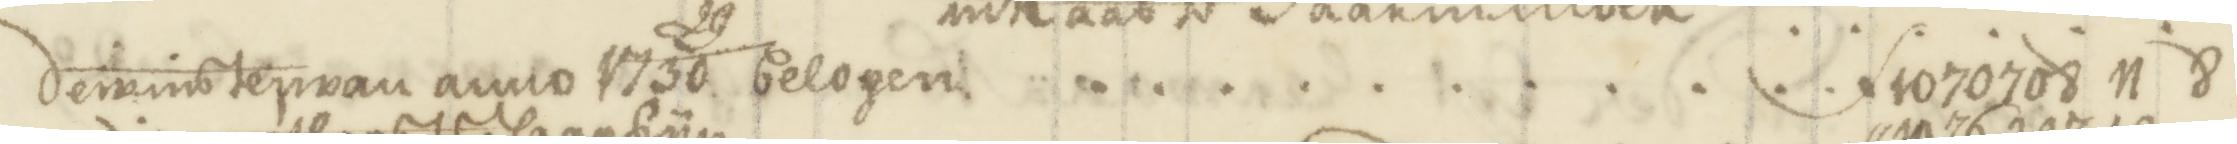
dewinsten van anno 1729/30 belopen . . . . . . . . . . . ƒ1070708 11 8
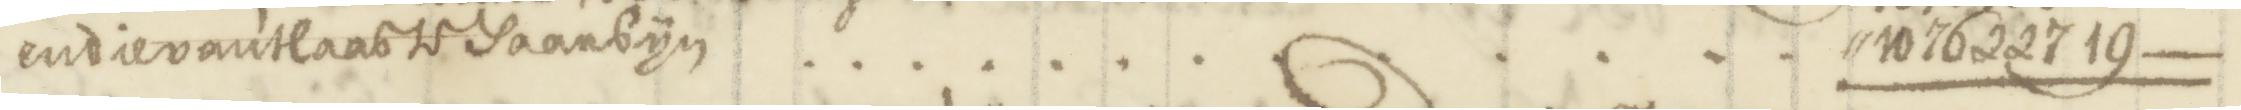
en die van't laaste Iaar sijn . . . . . . . . . . . - - „1076227 19 —
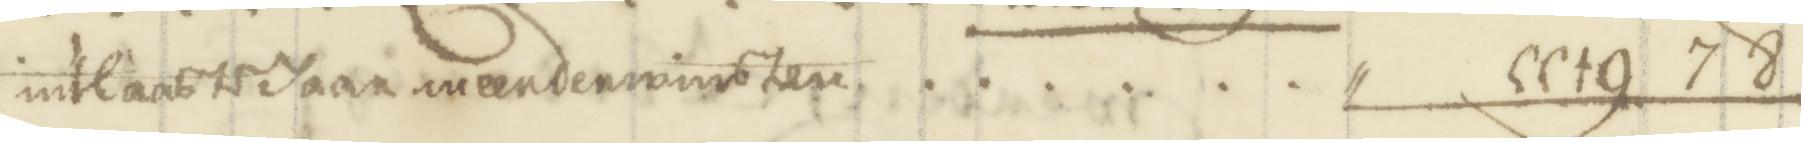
in't laaste Iaar meerder winsten . . . . . . . „ 5519 7 8
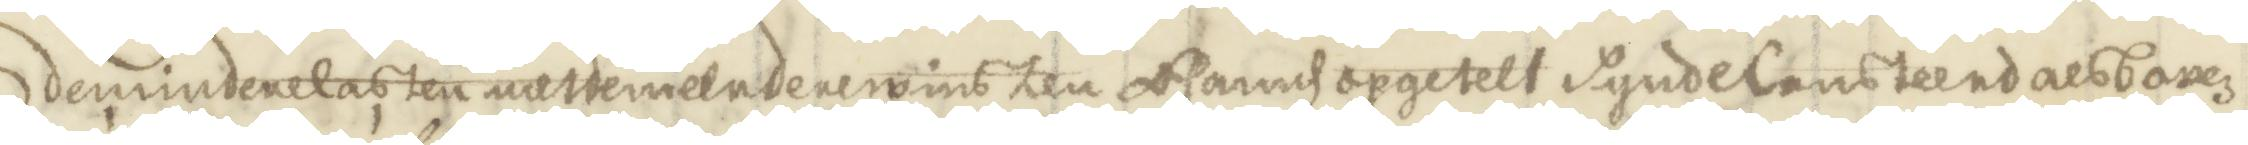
demindere lasten met de meerdere winsten tesamen opgetelt synde Consteerd als boven
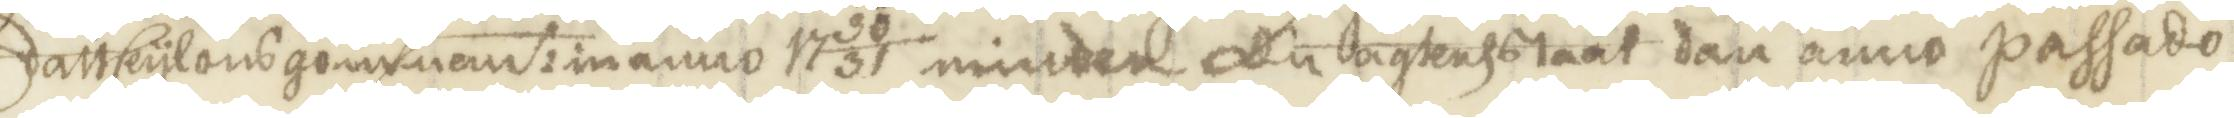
dat't Ceijlons gouvernem:t in anno 1730/31 minder ten agteren staat dan anno passado
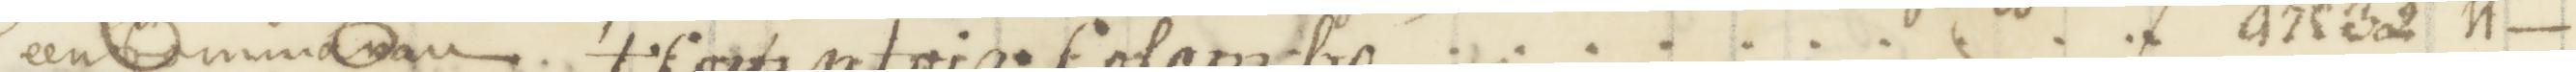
een somma van . . . . . . . . . . . . . .ƒ 47532 11 —
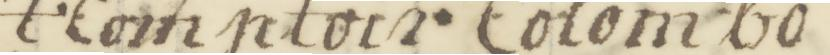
't Comptoir Colombo
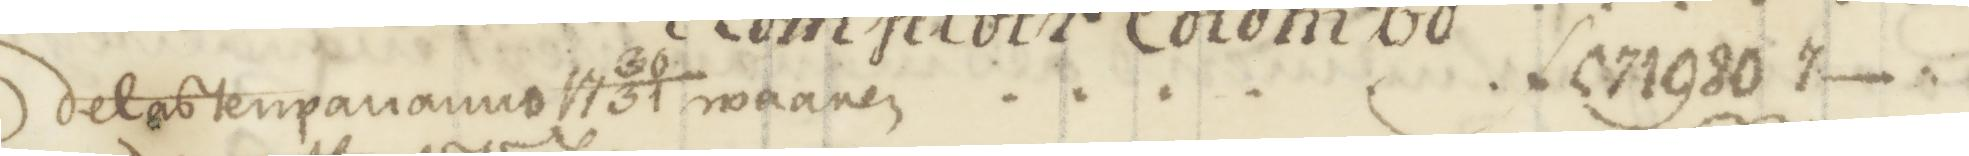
de lasten van anno 1730/31 waaren . . . . . . ƒ571980 7—
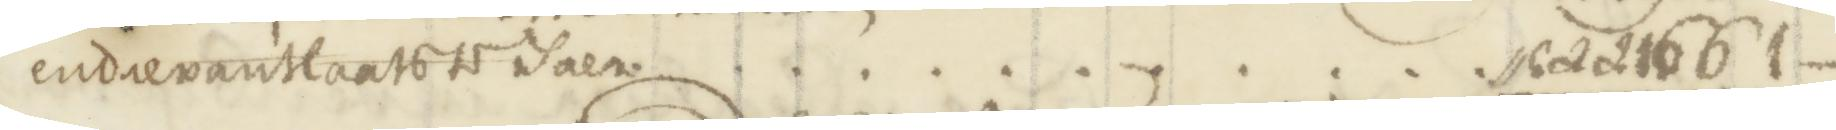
en die van't laatste Iaer. . . . . . . . . . . . „ 622166 1 —
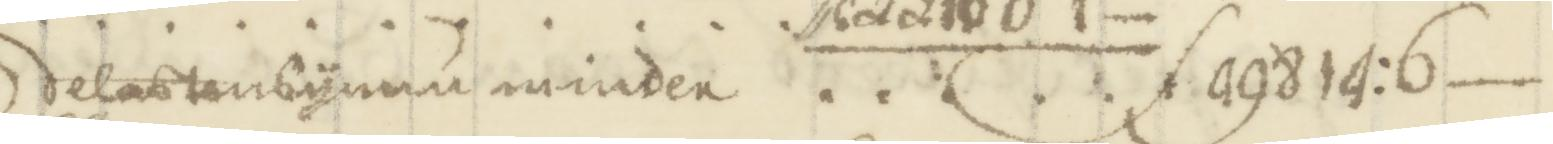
delasten sijn nu minder . . . . . ƒ49814:6 —
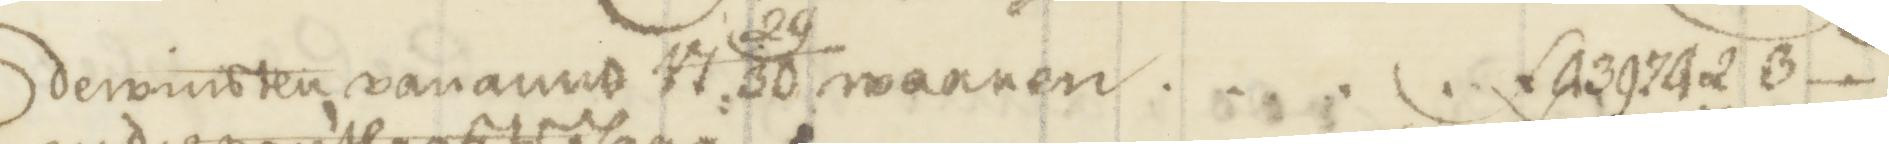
dewinsten van anno 1729/30 waaren . . . . . . ƒ439742 3 —
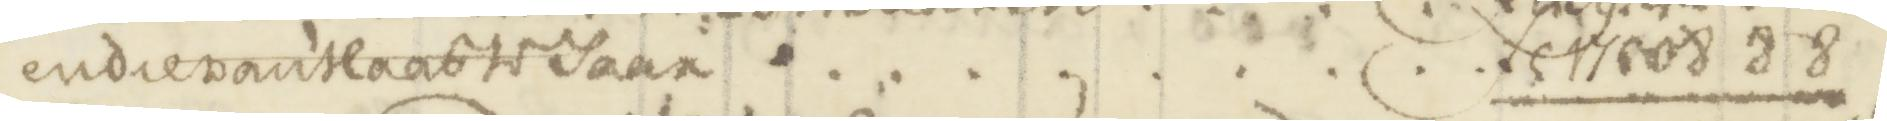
en die van't laaste Iaar . . . . . . . . . . ƒ517608 8 8
